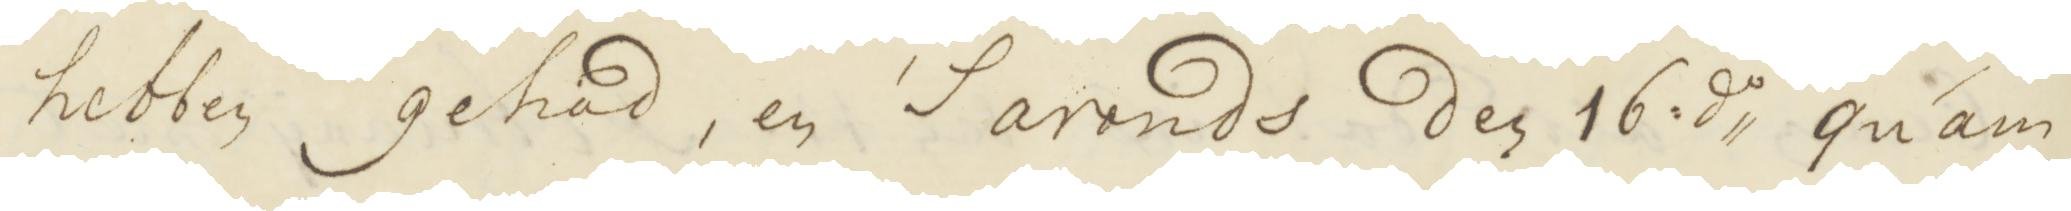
hebben gehad, en ’s avonds den 16: d„o quam
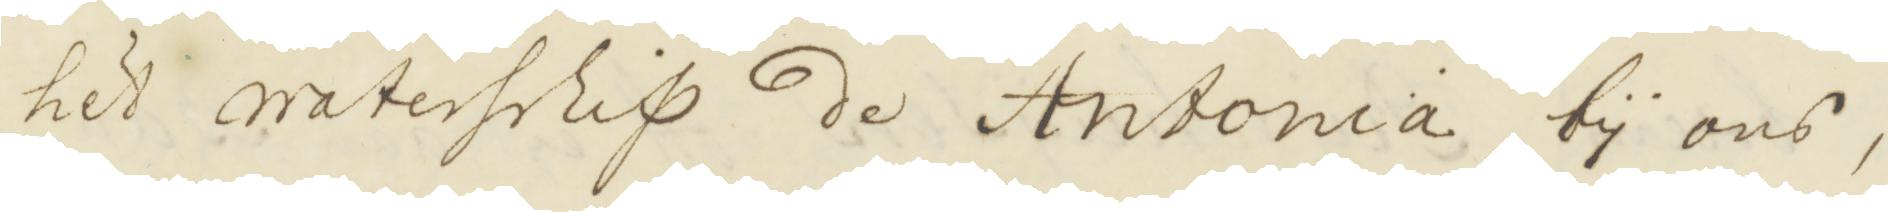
het waterschip de Antonia bij ons
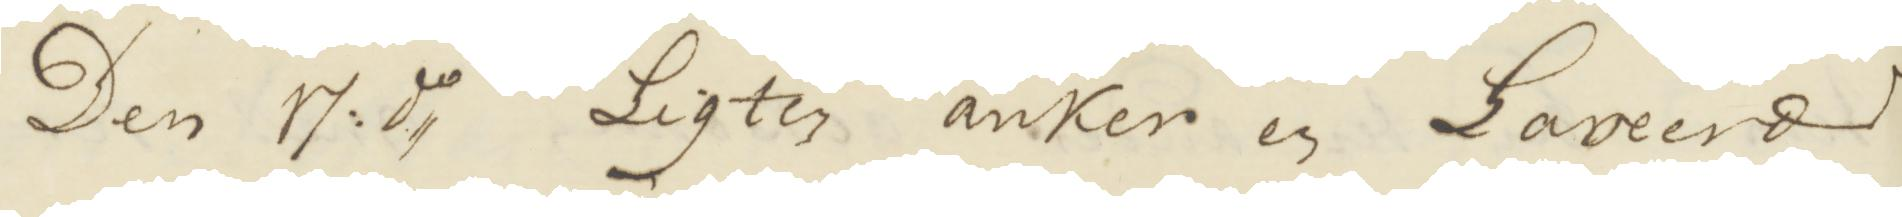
Den 17: d„o ligten anker en laveerde
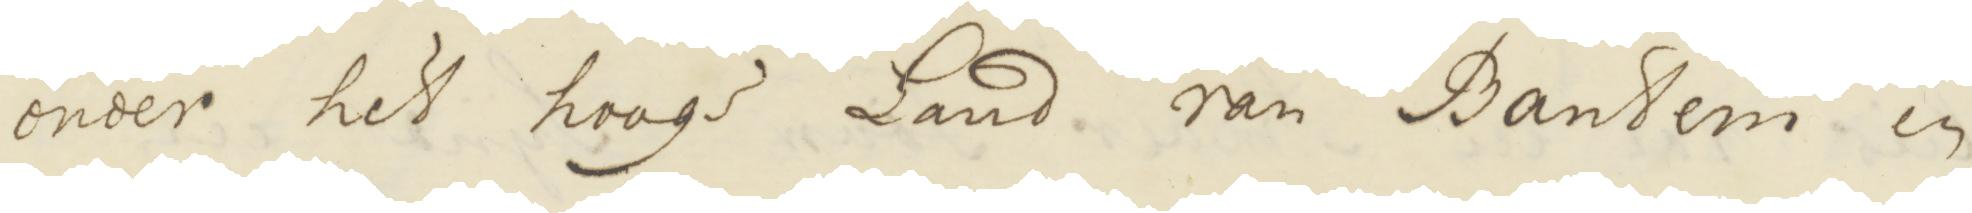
onder het hooge land van Bantem en
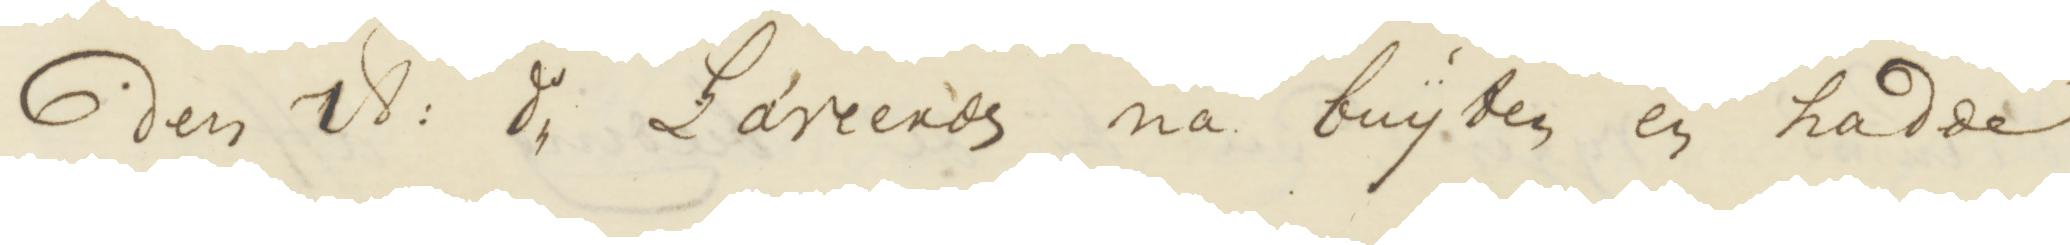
den 18: d„o laveerden na buijten en hadde
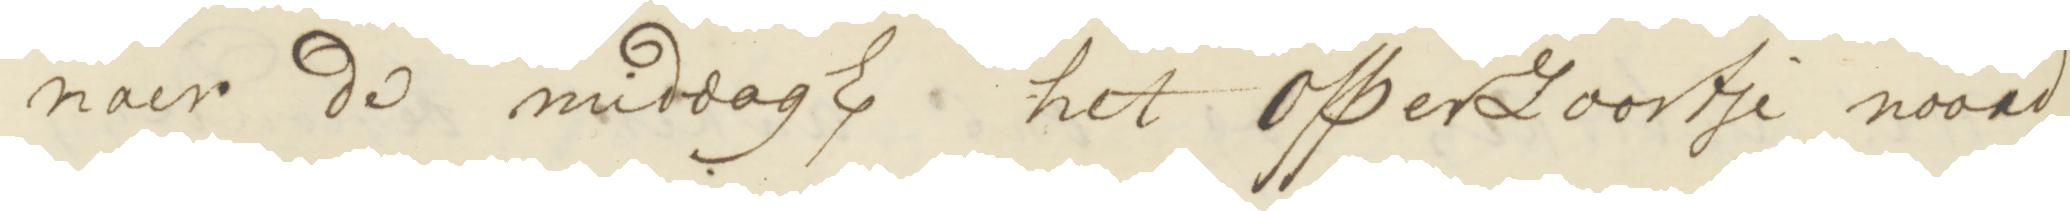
naer de middagh het opperZoortje noord
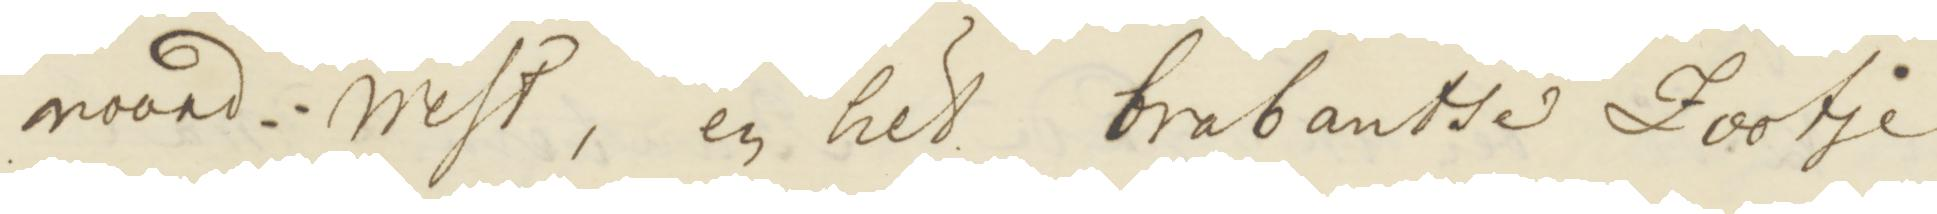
noord--west, en het brabantse Zootje
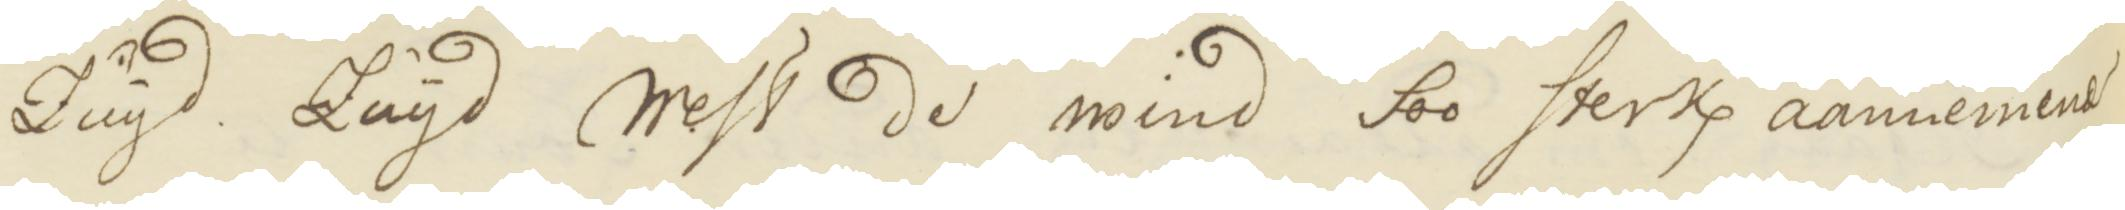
Zuijd Zuijd west de wind soo sterk aannemende
